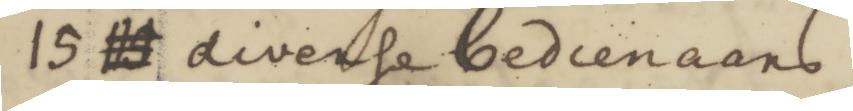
15 5 diverse bedienaars
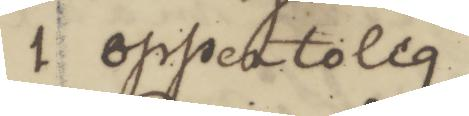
1. oppertolcq
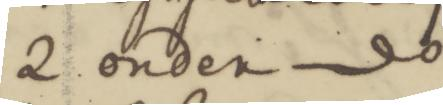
2 onder _o
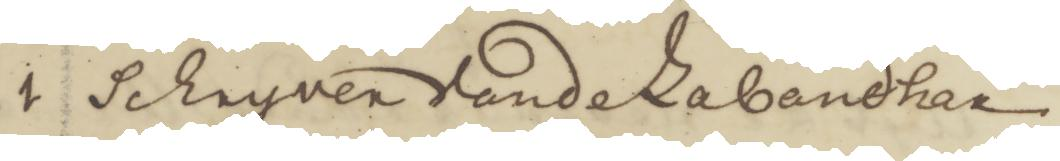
1 schryver van de Zabandhar
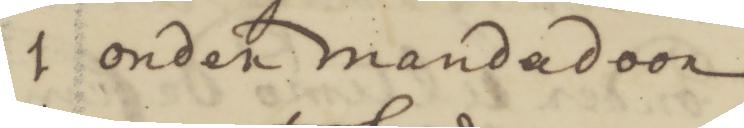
1 onder mandadoor
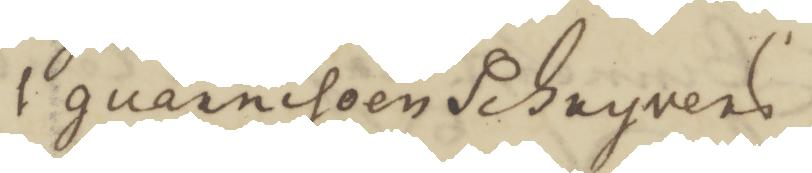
1 guarnisoenschryvers
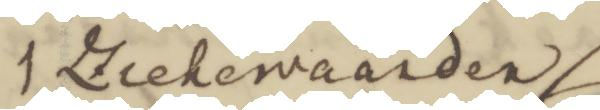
1 ziekewaarder
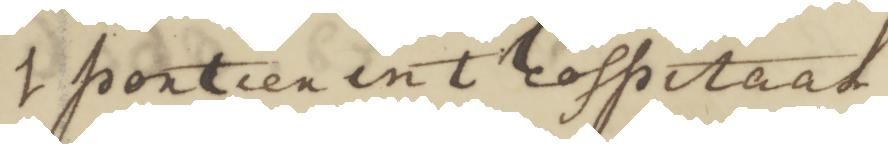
1 portier in ’t hospitaal
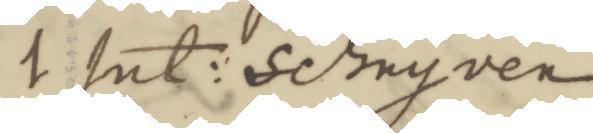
1 Inl: schryver
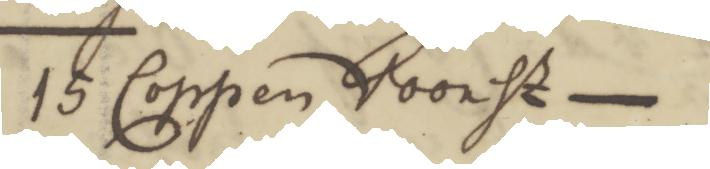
15 Coppen voorsz —
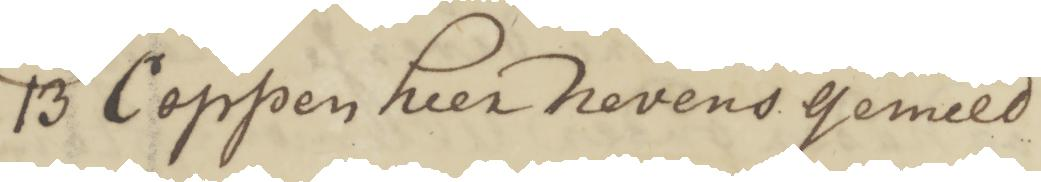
13 Coppen hier nevens gemeld
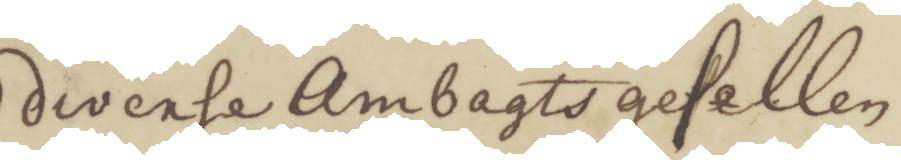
diverse Ambagtsgesellen
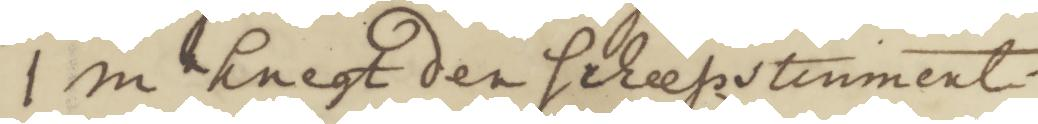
1 m=r knegt der scheepstimmerl.
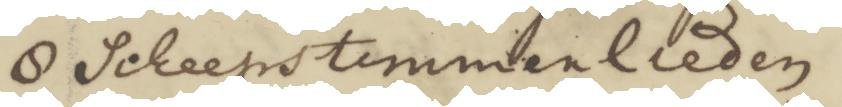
8 scheeps timmerlieden
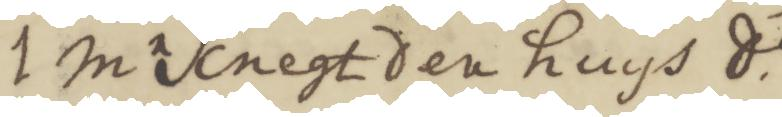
1 mr knegt der huys d.o
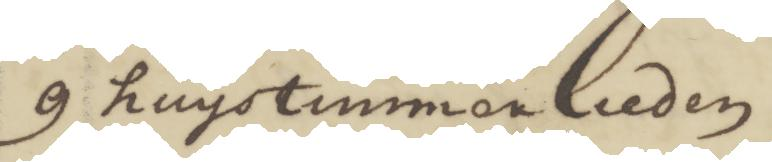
9 huystimmer lieden
